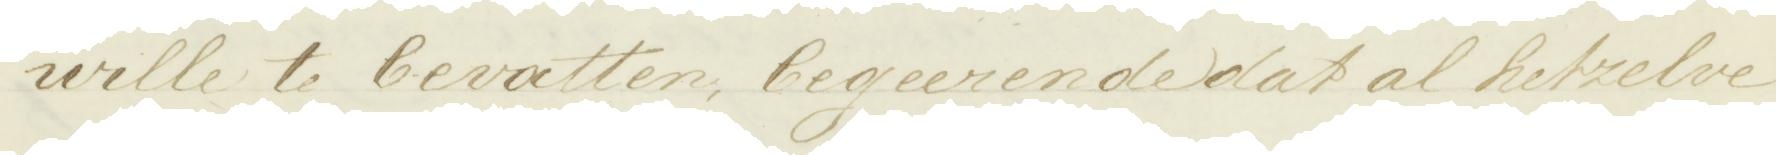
wille te bevatten, begeerende dat al hetzelve
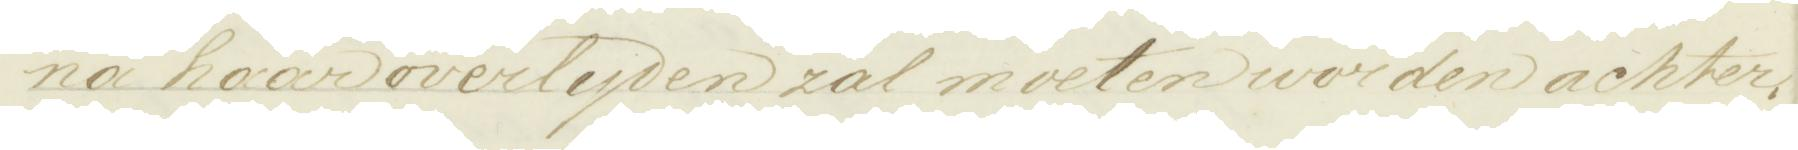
na haar overlyden zal moeten worden achter„
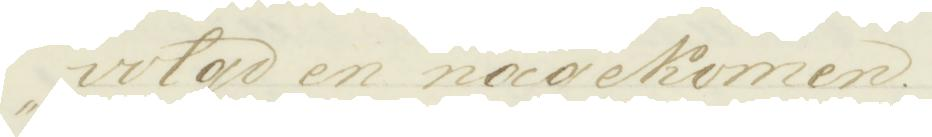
„volgd en nagekomen.
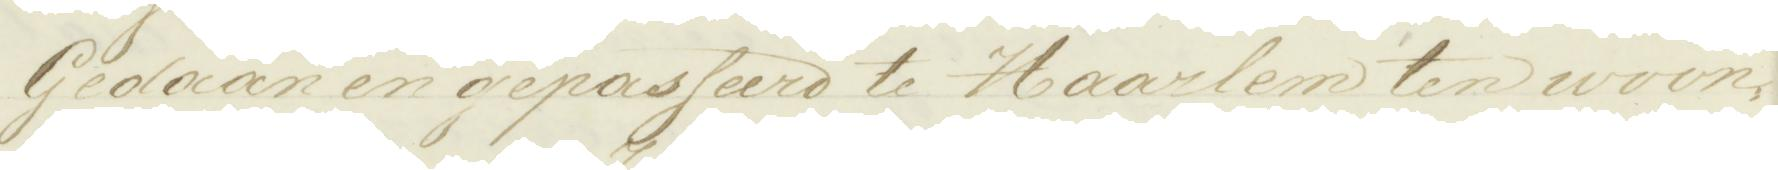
Gedaan en gepasseerd te Haarlem ten woon„
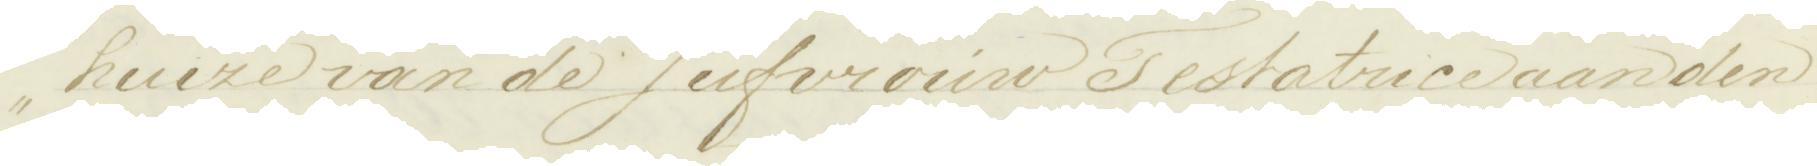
„huize van de Jufvrouw Testatrice aan den
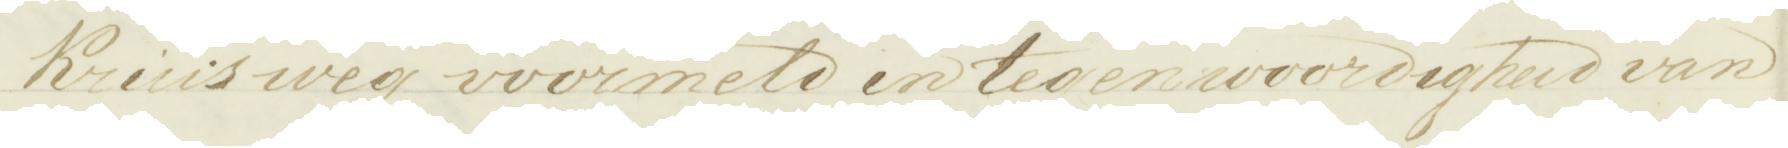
Kruisweg voormeld in tegenwoordigheid van
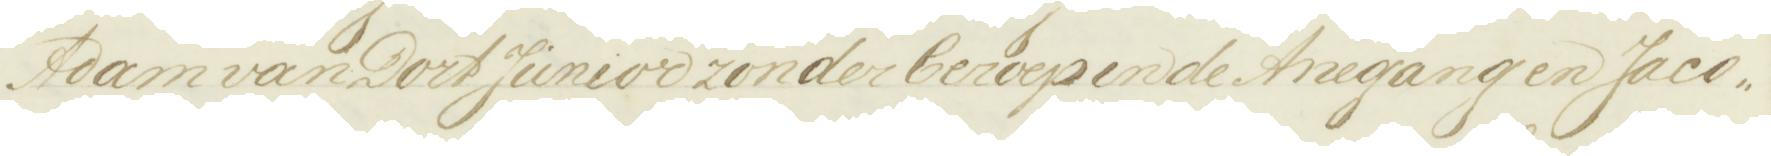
Adam van Dort Junior zonder beroep in de Anegang en Jaco„
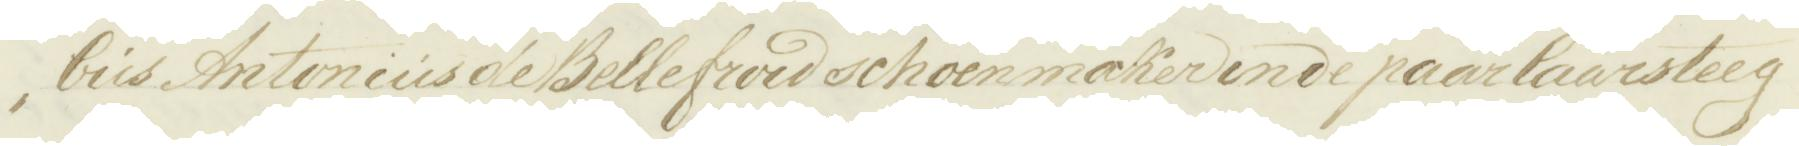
„bus Antonius de Bellefroid schoenmaker in de paarlaarsteeg
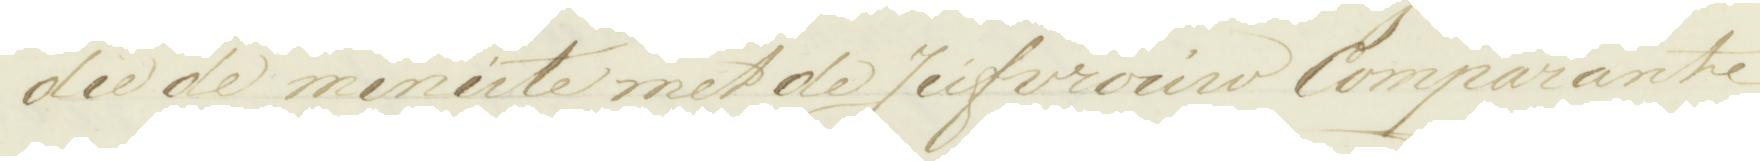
die de minute met de Jufvrouw Comparante
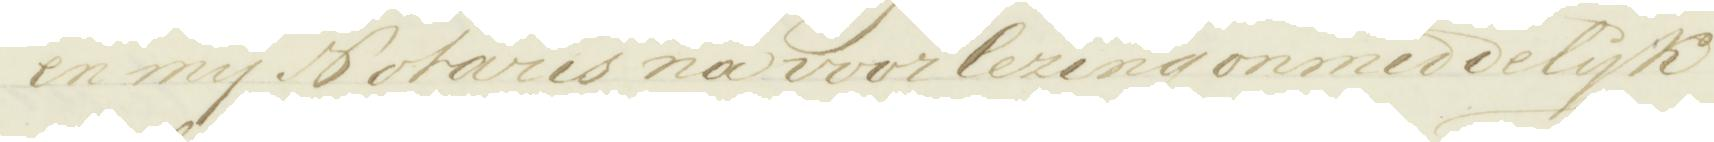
en mij Notaris na voor lezing onmiddelijk
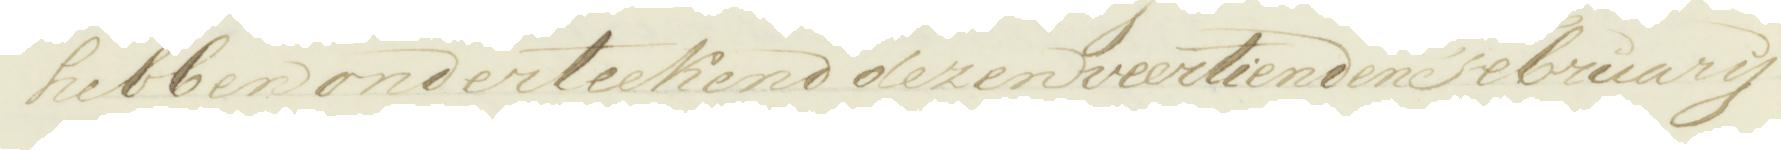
hebben onderteekend dezen veertienden Februarij
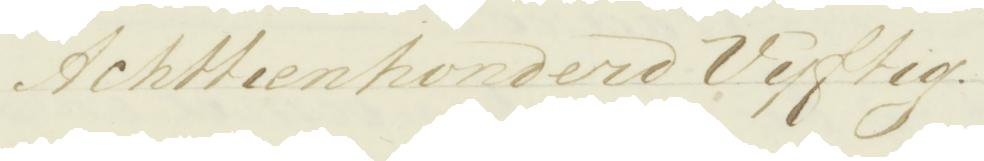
Achttienhonderd Vijftig.
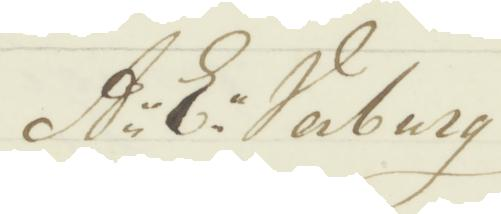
A: E: Verburg
